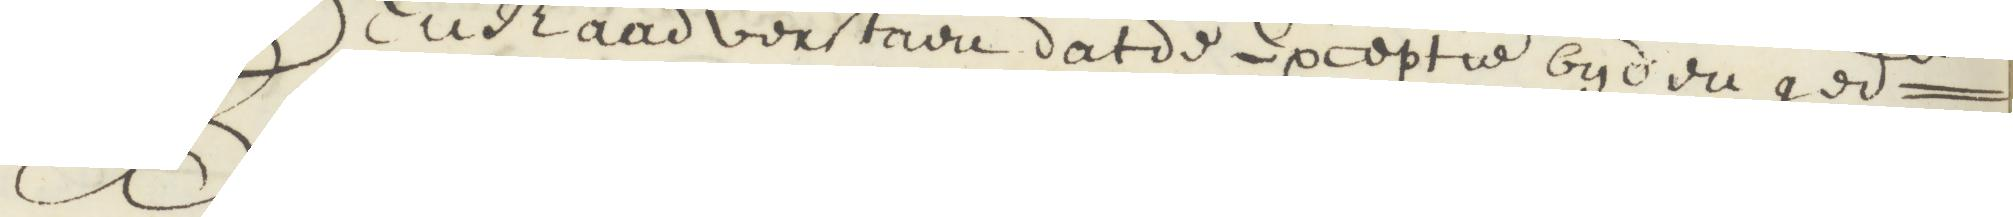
Den Raad verstaen dat de Exceptie bij den ged=e
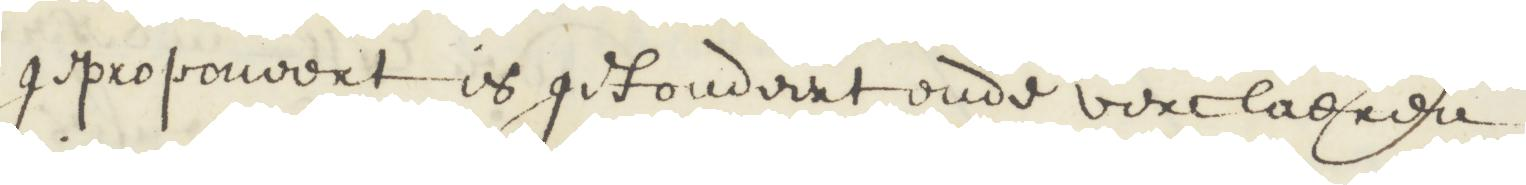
geproponeert is gefondeert ende verclaeren
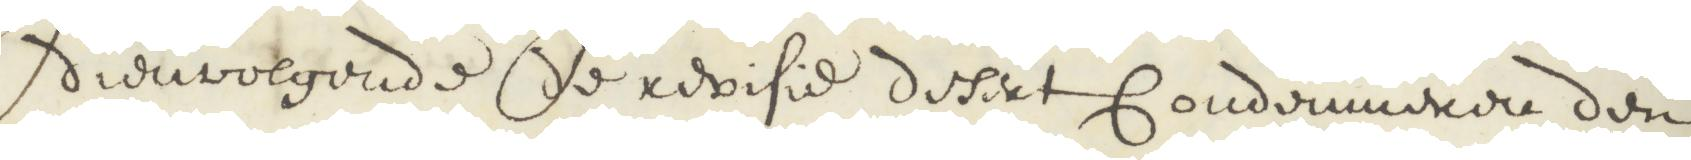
dienvolgende de revisie deser t Condemneren den
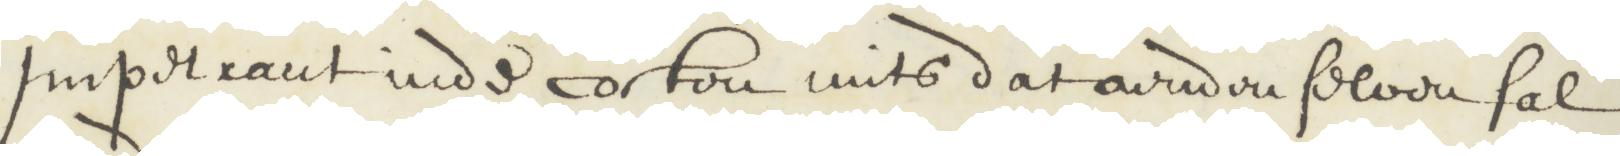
jmpetrant inde costen mits dat aenden selven sal
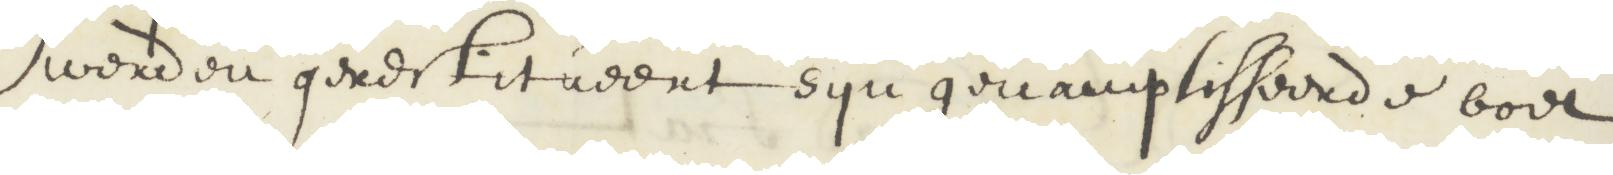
werden gerestitueert sijn genamptisseerde boet
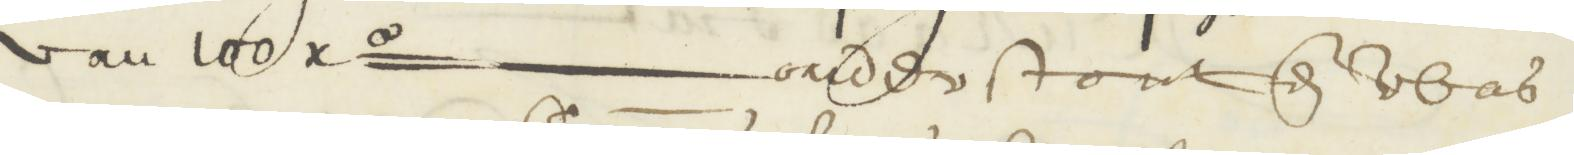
van 100 r=a onderstont en was
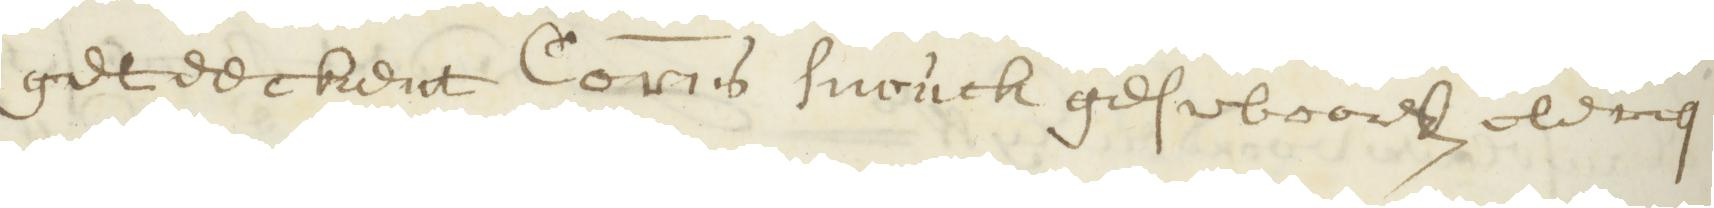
geteeckent Corns snouck geswooren clercq
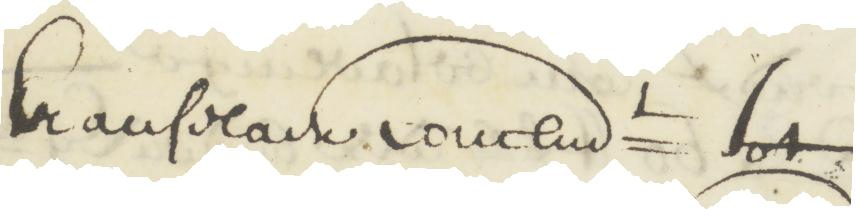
kanselaer conclud=t tot
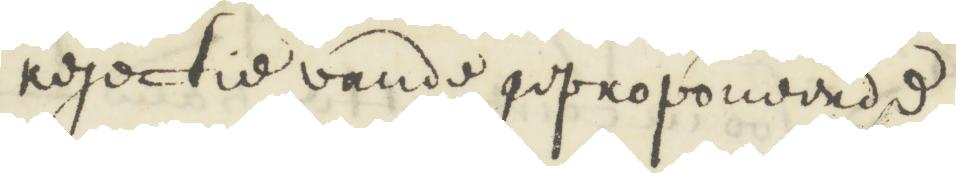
rejectie vande geproponeerde
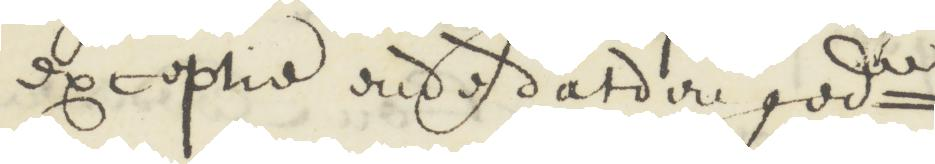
exceptie ende dat den ged=e
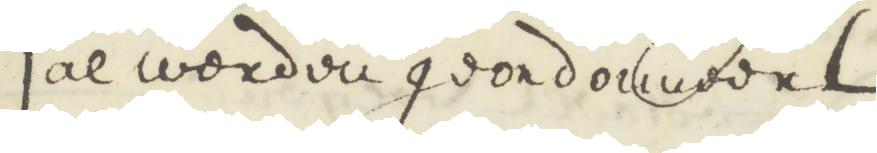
sal werden geordonneert
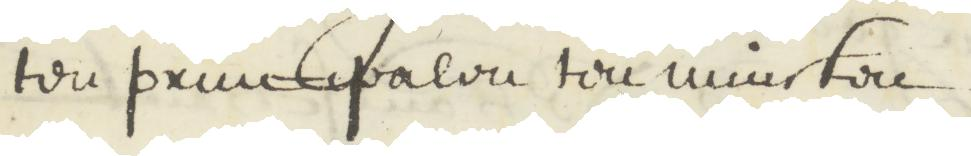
ten principalen ten minsten
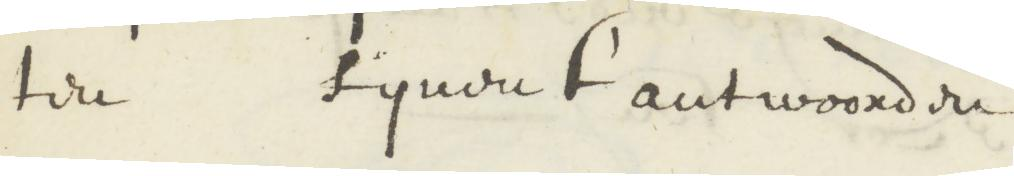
ten fijnen t' antwoorden
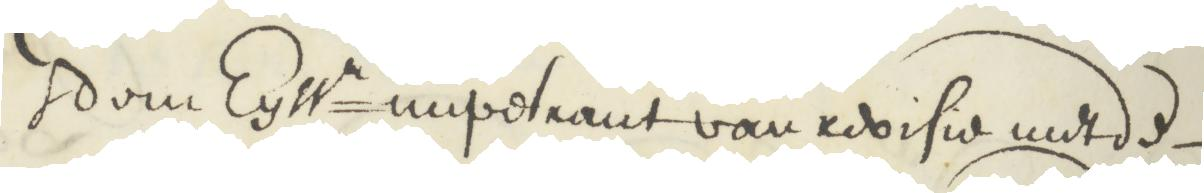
Idem Eijss=r impetrant van revisie met de
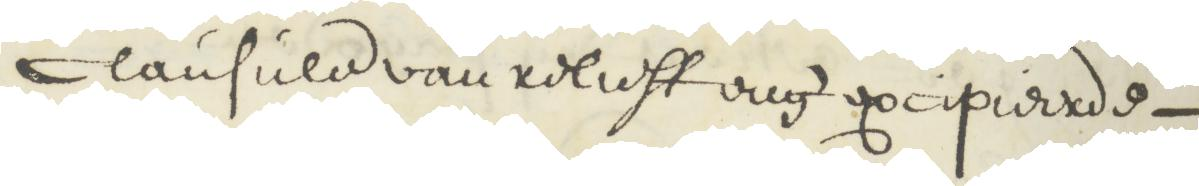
clausule van relieff en g' excipierde
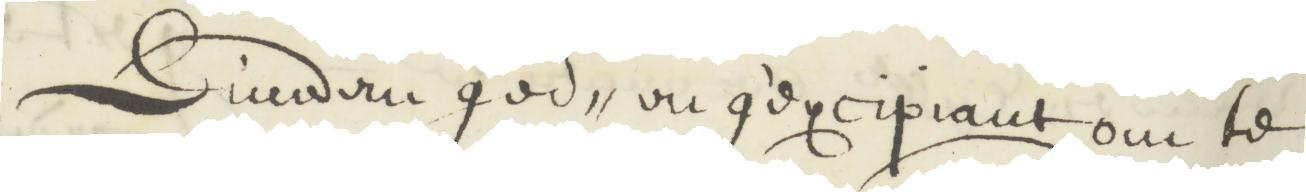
Eiundem ged„e en g'excipiant om te
